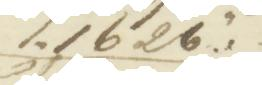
„1626„
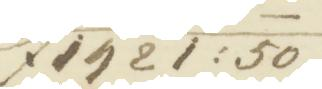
ƒ1921: 50
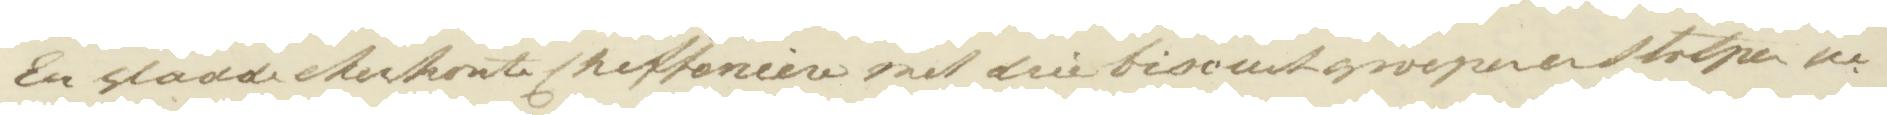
En gladde ekenhoute Chiffoniere met drie biscuit groepen en stolpen ge
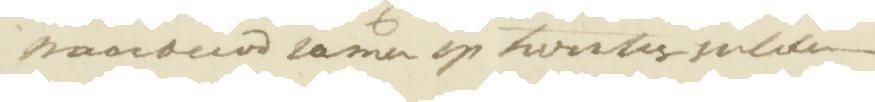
waarderd zamen op twintig gulden
